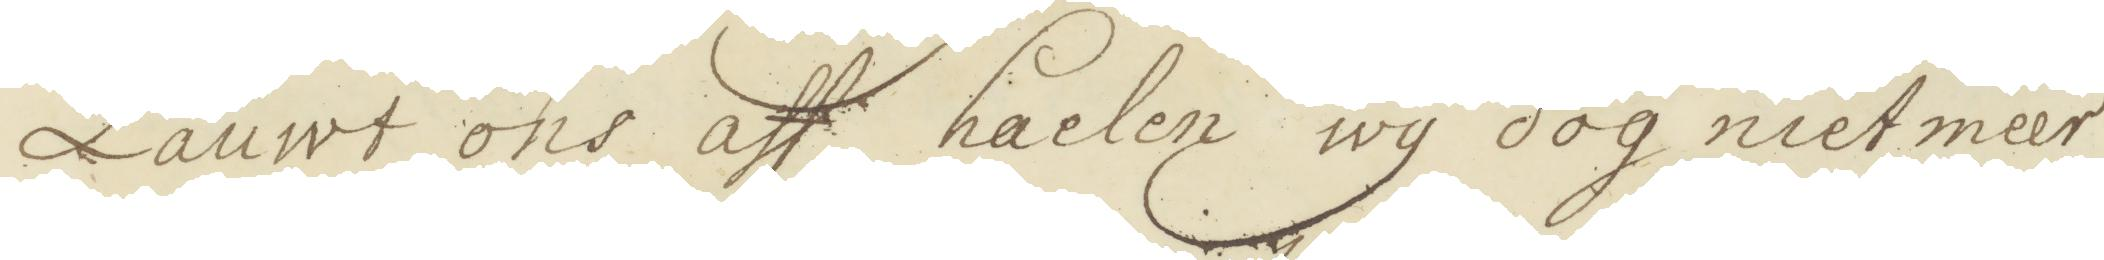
Lauwt ons aff haelen wij dog niet meer
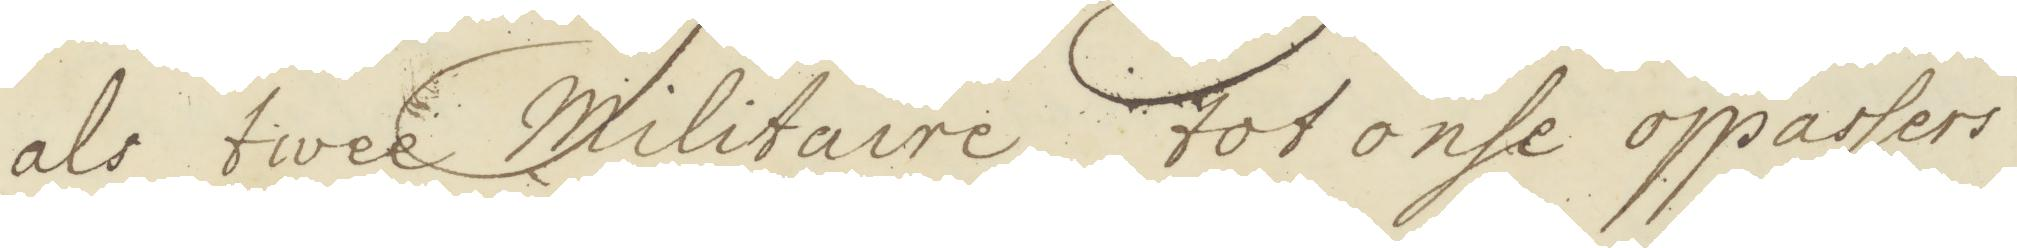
als twee Militaire tot onse oppassers
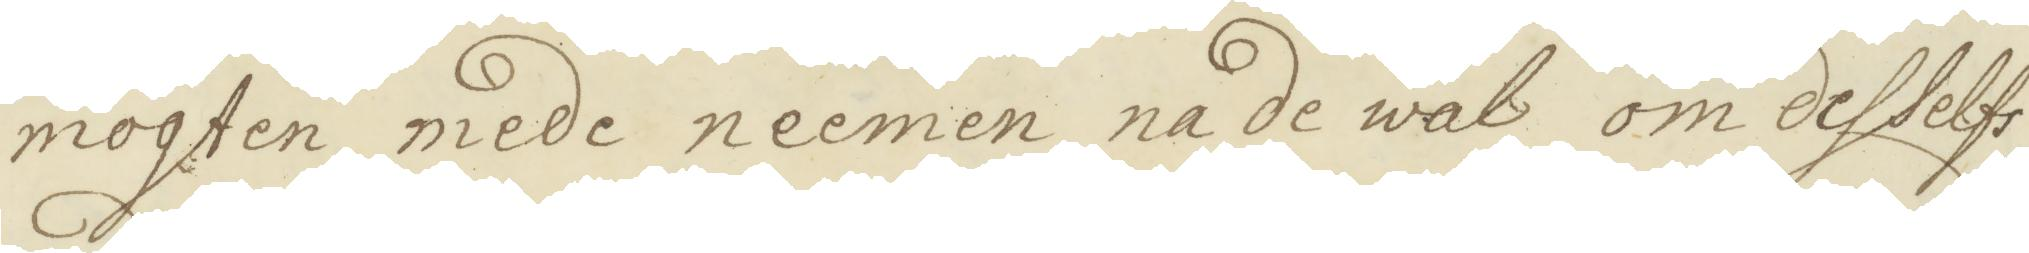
mogten mede neemen na de wal om desselfs
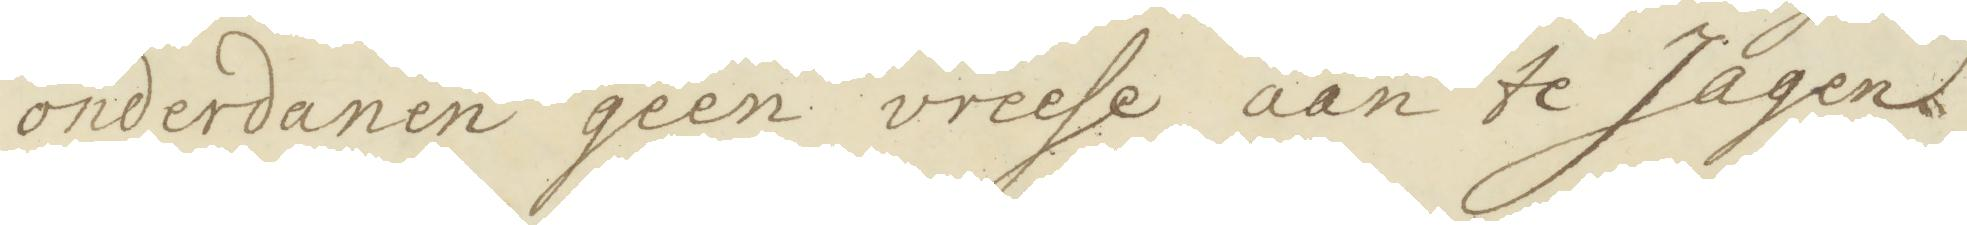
onderdanen geen vreese aan te Jagen
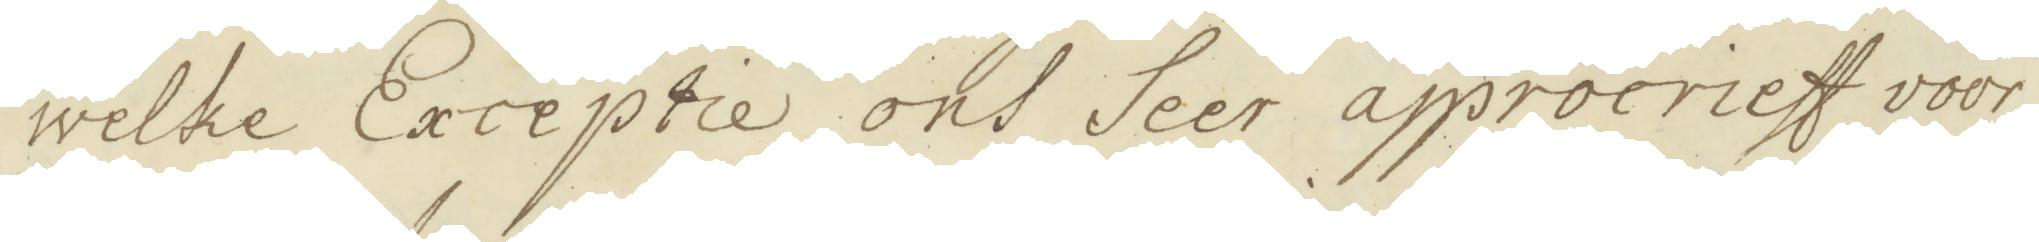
welke Exceptie ons seer approcrieff voor
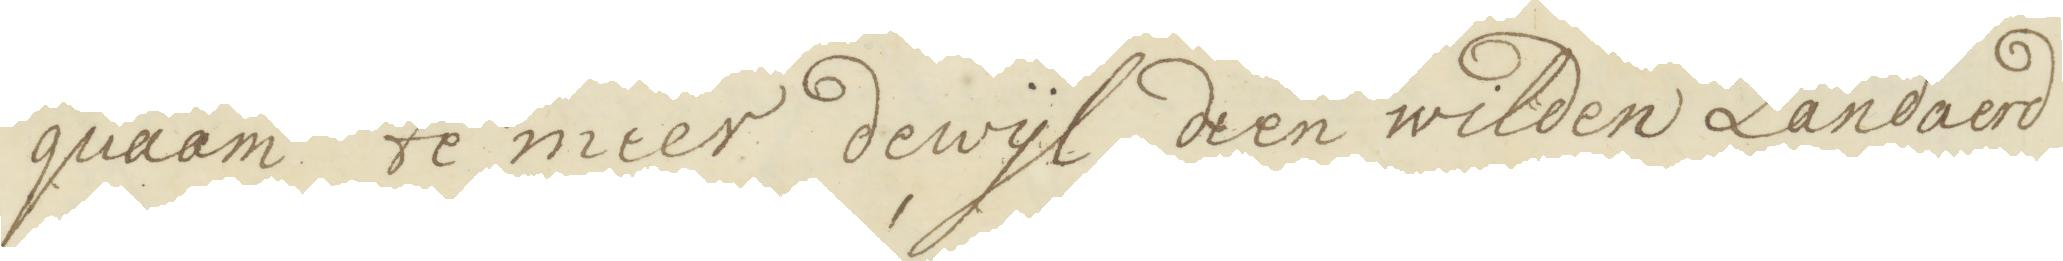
quaam te meer dewijl dien wilden Landaerd
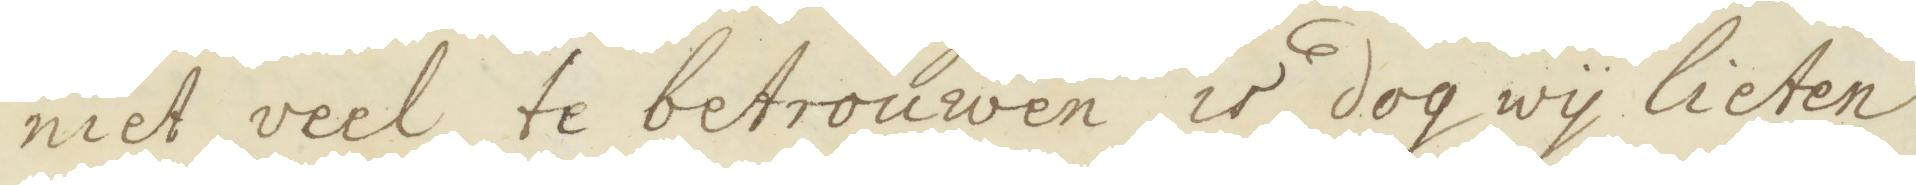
niet veel te betrouwen is dog wij lieten
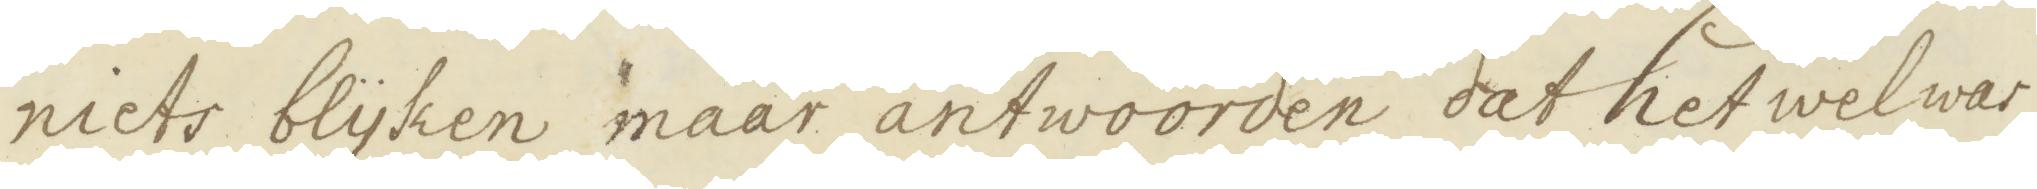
niets blijken maar antwoorden dat het wel was
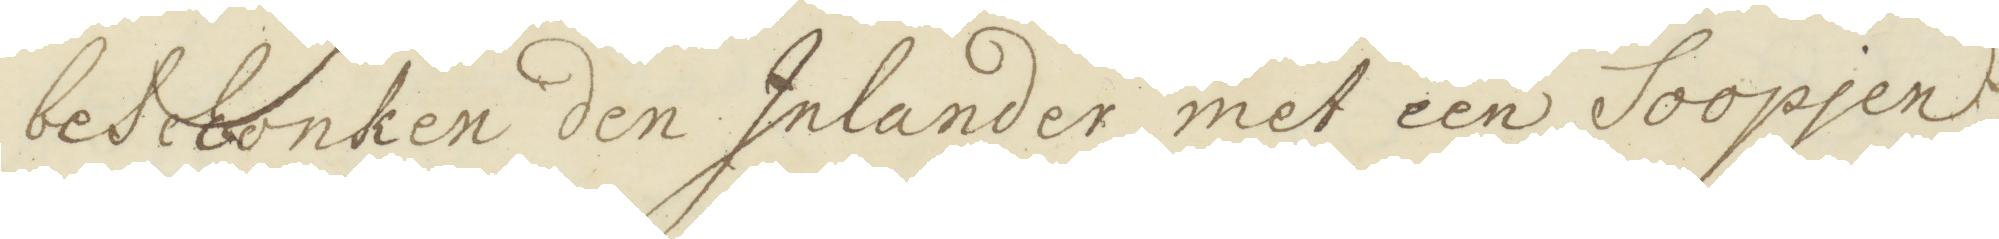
beschonken den Jnlander met een soopjen
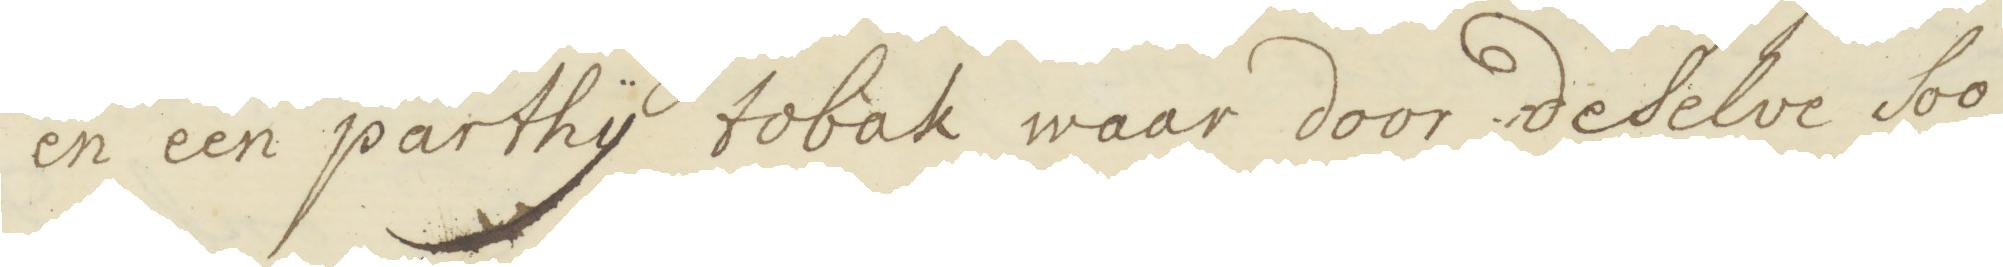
en een parthij tobak waar door deselve soo
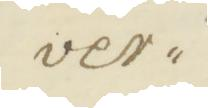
ver„
